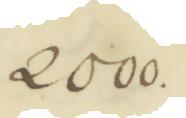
2000.
